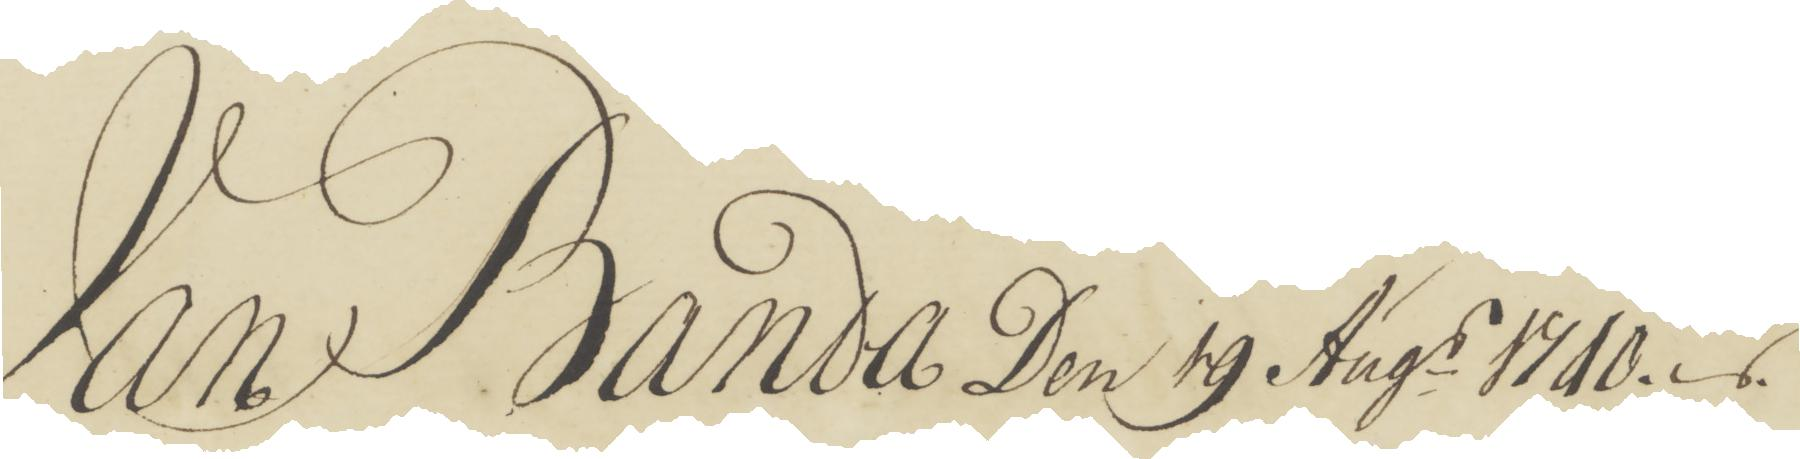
Van Banda Den 19 Aug=s 1740. —.
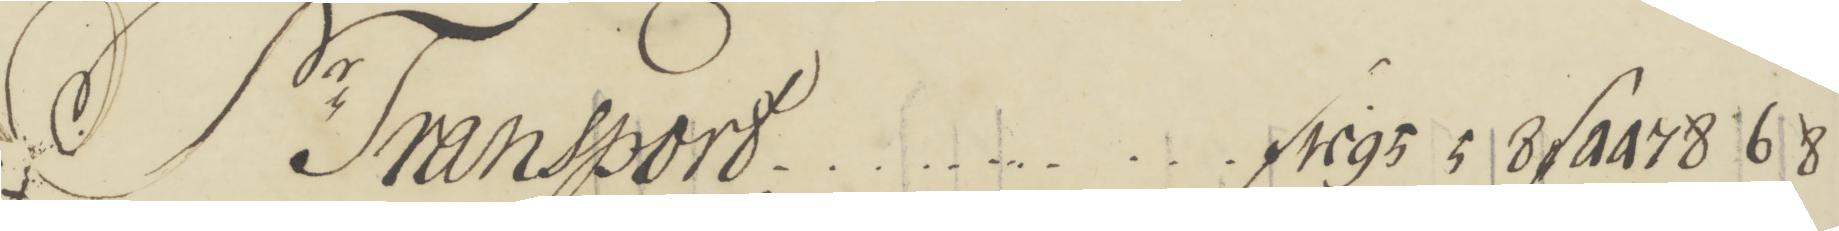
P„r Transport - - - - - - - - - - - - ƒ 1595 5 8 ƒ 4478 6 8
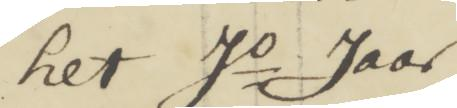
het J=o Jaar
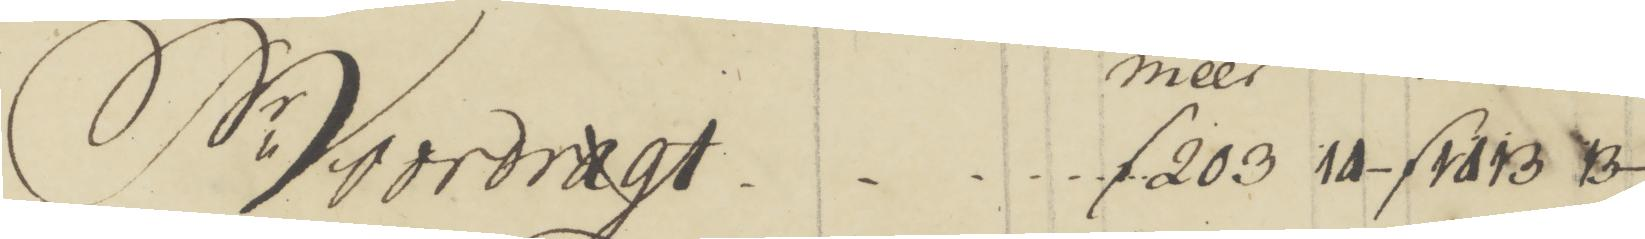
P„r Voordragt - - - - - -ƒ - - 203 14 — ƒ 1413 13 —
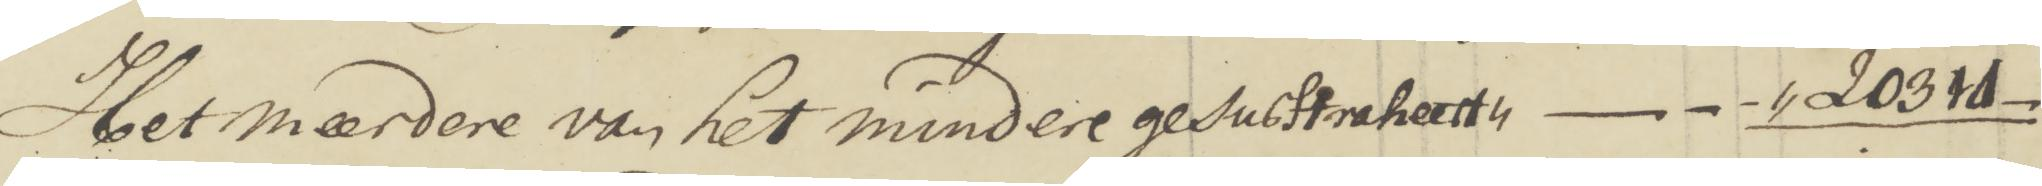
Het meerdere van het mindere gesubstraheert „ — - - „ 203 14 —
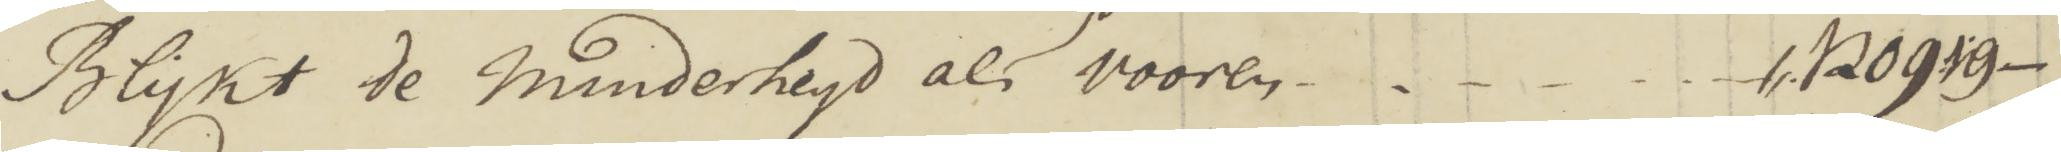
Blijkt de minderheyd als vooren - - - - - - - „ 1209:19 —
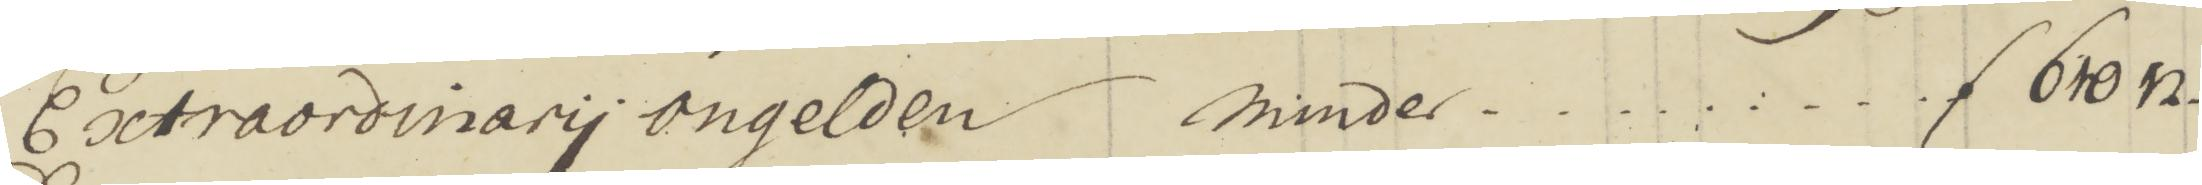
Extraordinarij ongelden minder - - - - - - - - ƒ 610 12
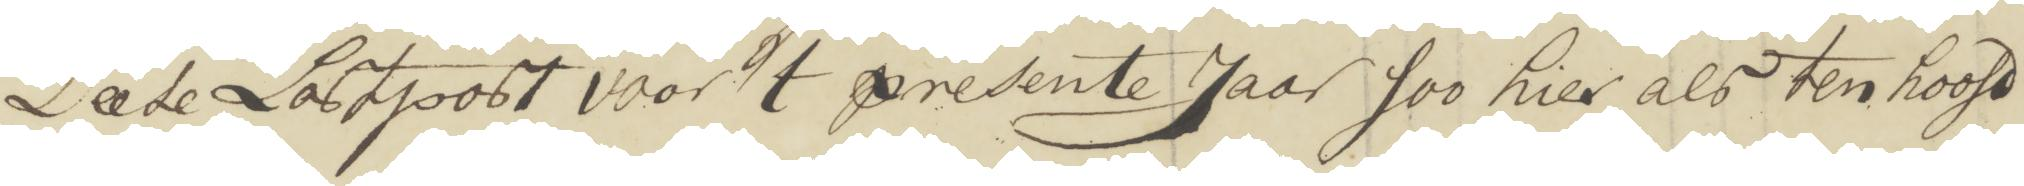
Deese Lastpost voor ’t presente Jaar soo hier als ten hoofd
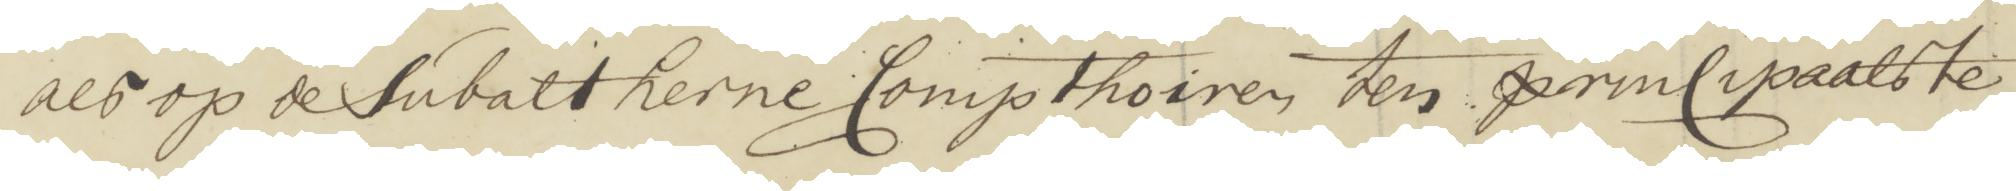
als op de subaltherne Compthoiren ten principaalste
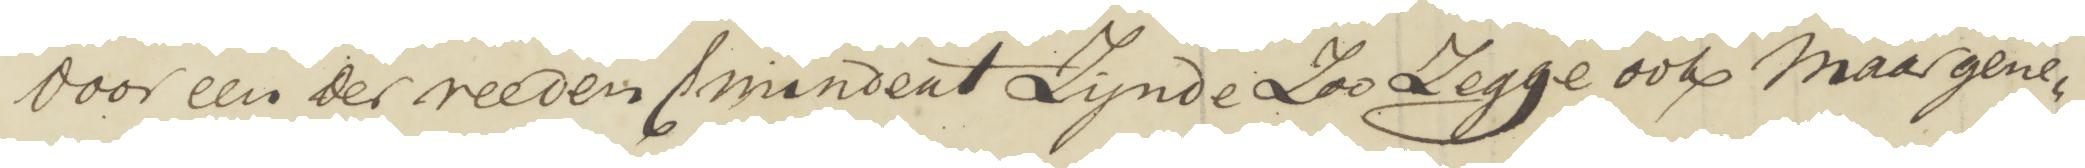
door een der reeden vermindert zijnde zoo zegge ook maar gene„
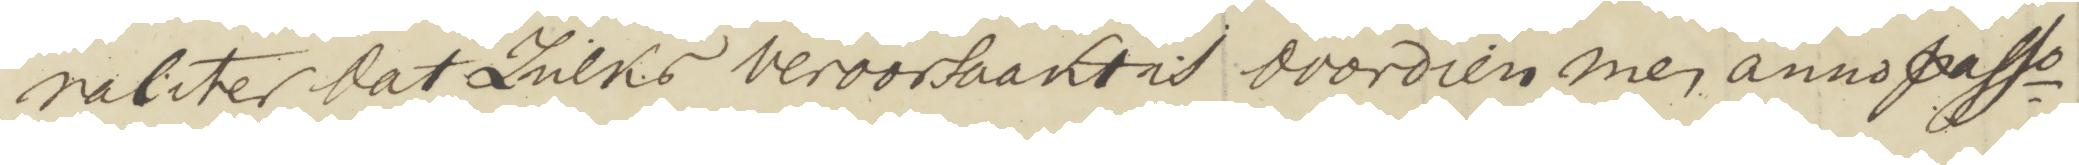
raliter dat zulks veroorsaakt is doordien men anno pass=o
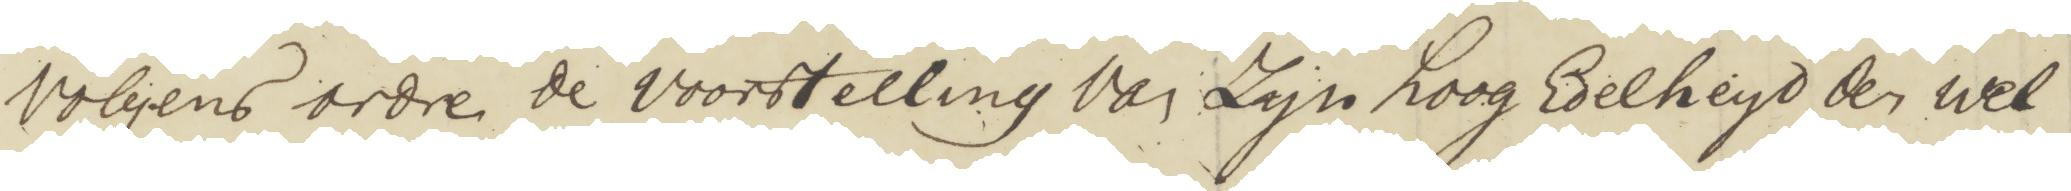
volgens ordre de voorstelling van zijn hoog Edelheijd den wel
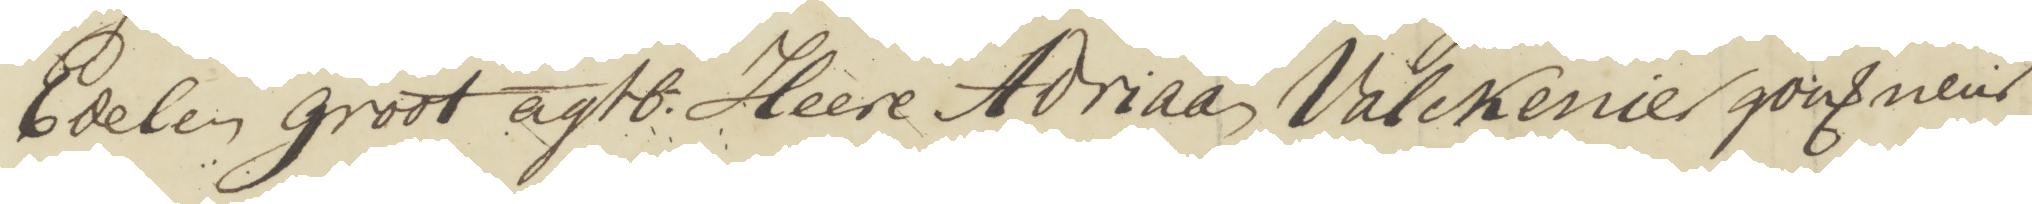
Edelen groot agtb: Heere Adriaan Valckenier gouverneur
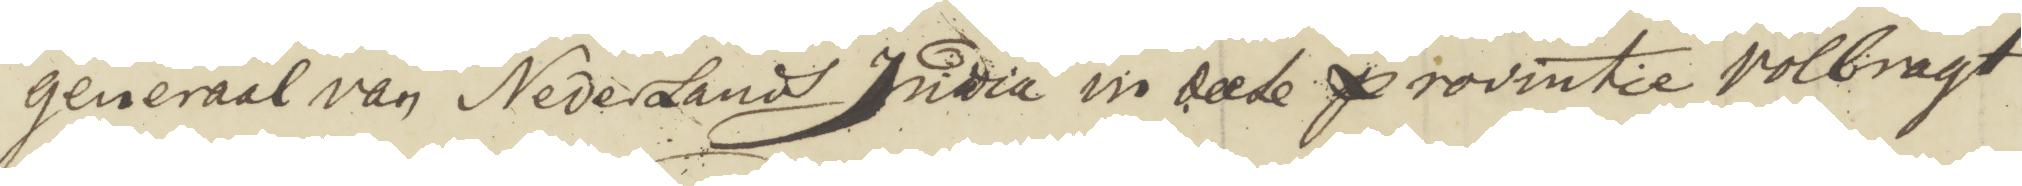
generaal van Nederlands Jndia in deese provintie volbragt
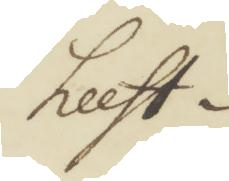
heeft —
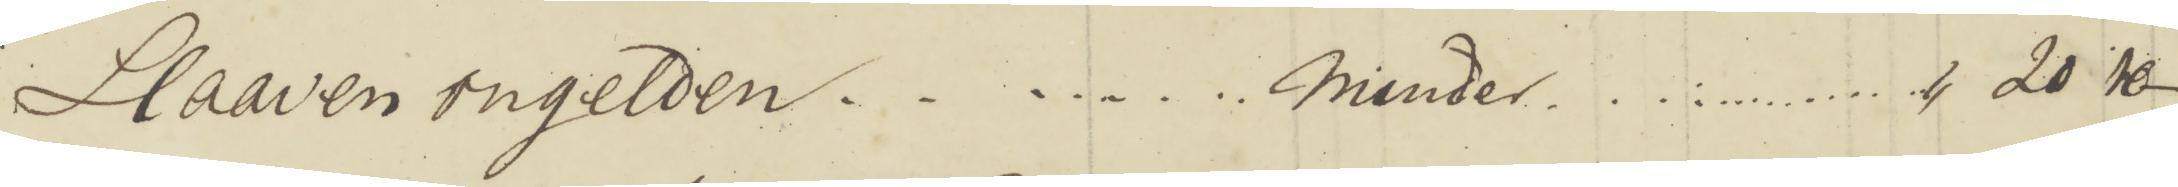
Slaaven ongelden - - - - - - - - minder - - - - - - - - - - - - - - - „ 20 10 —
